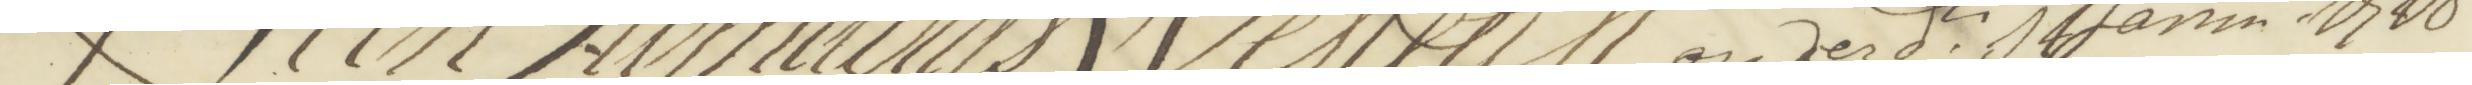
Van Sumatras West Cust onder d:n 11 Janu: 1748
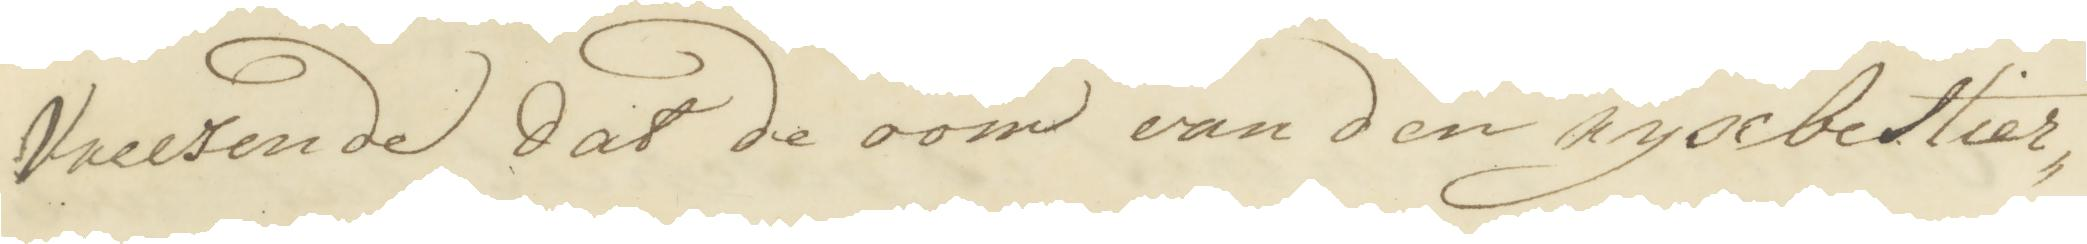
Vreesen de dat de oom van den ryxbestier„
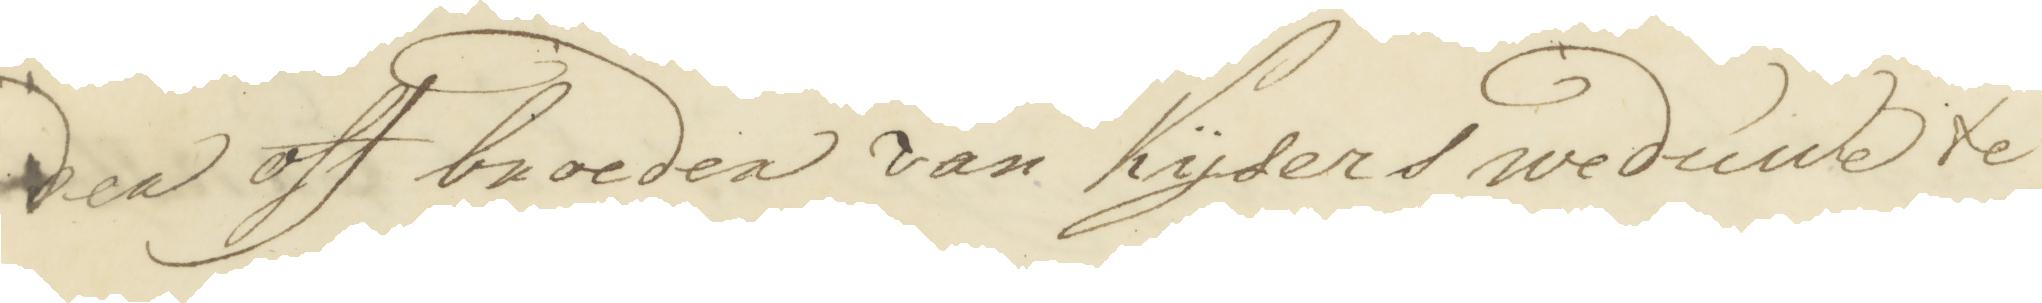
der off broeder van Kijsers weduwe te
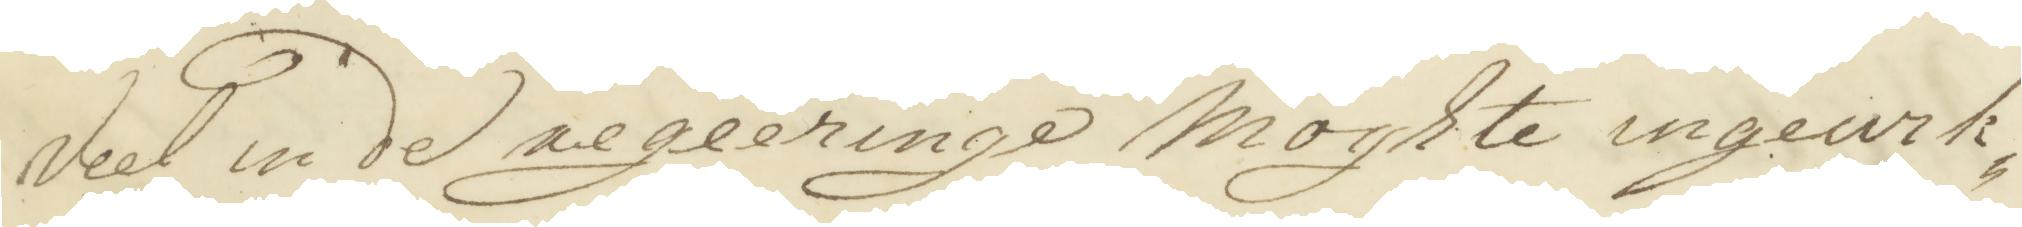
veel in de regeeringe moghte ingewik„
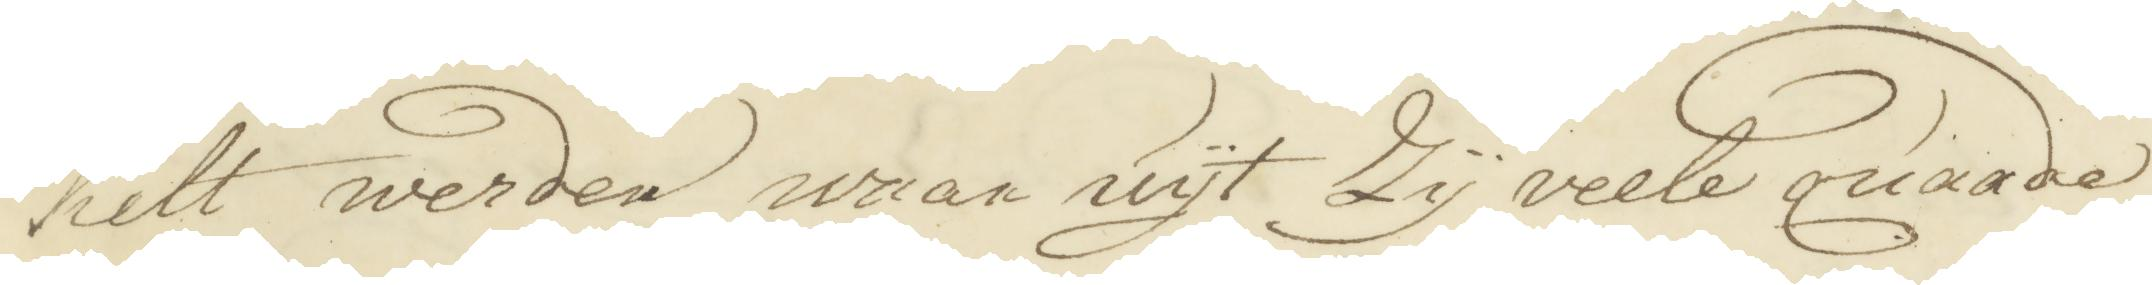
kelt werden waar uijt zij veele quaade
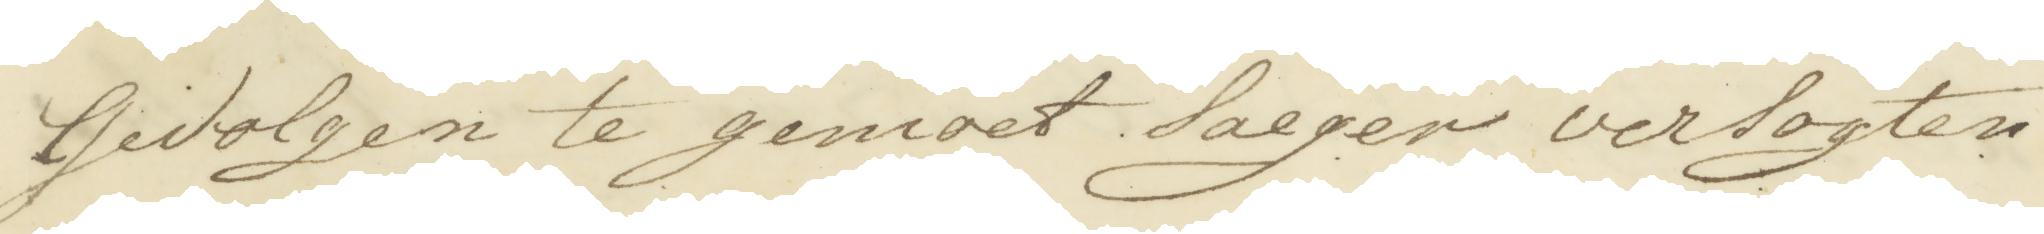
gevolgen te gemoet saeger versogten
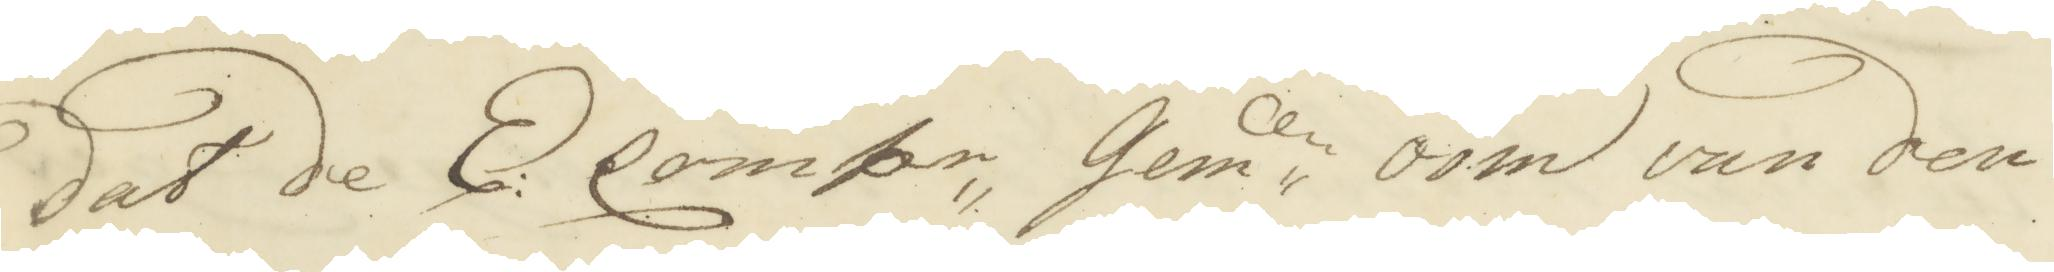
dat de E: Comp„r gem:en oom van den
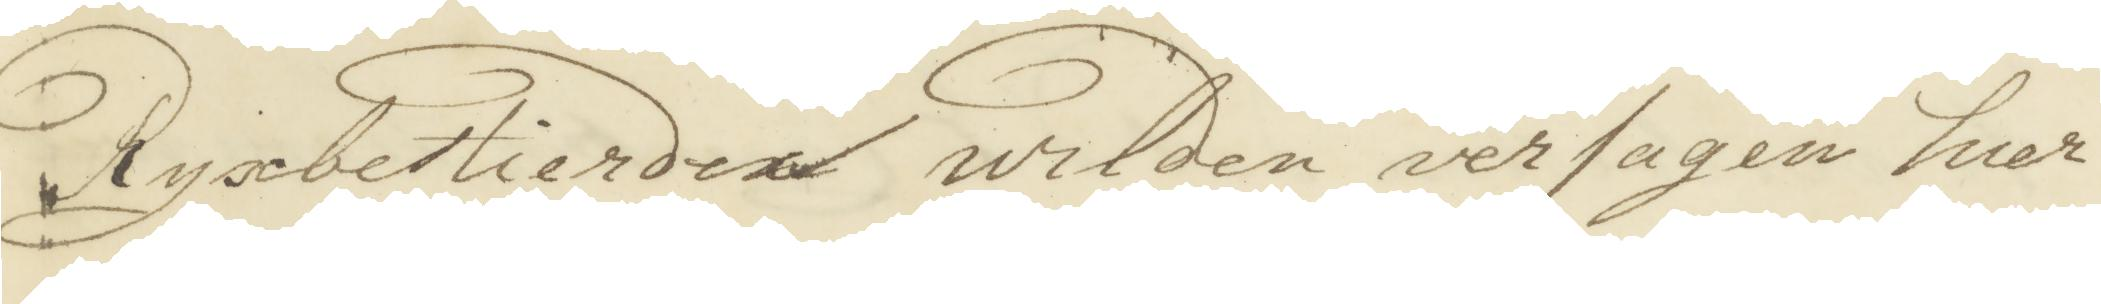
Ryxbestierder wilden versagen hier
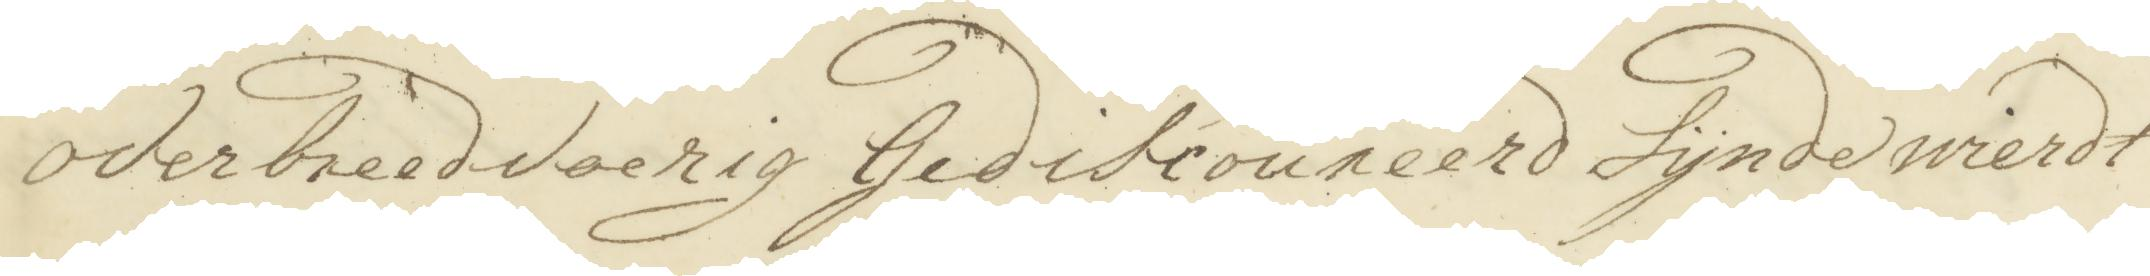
over breedvoerig gediscoureerd sijnde wierdt
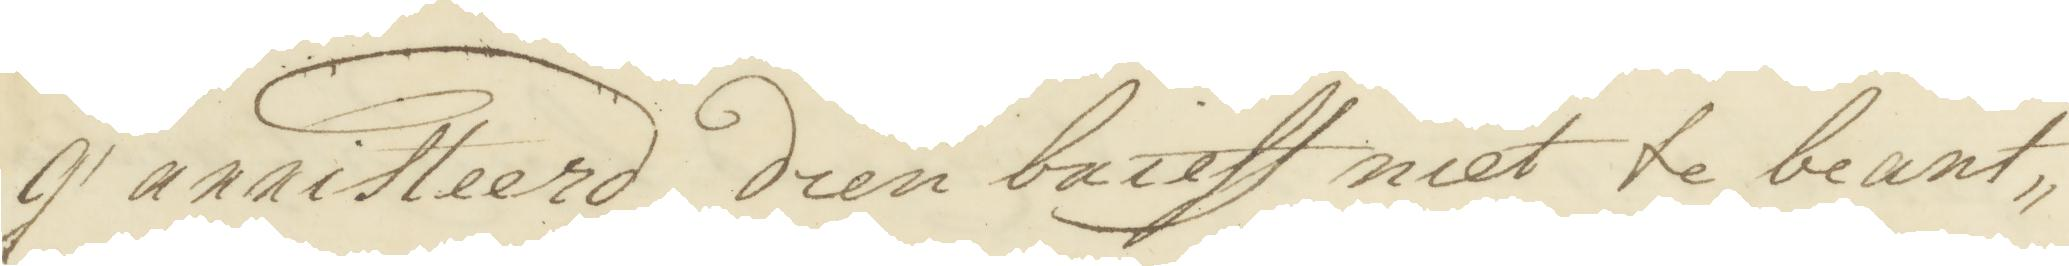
g’arristeerd dien brieff niet te beant„
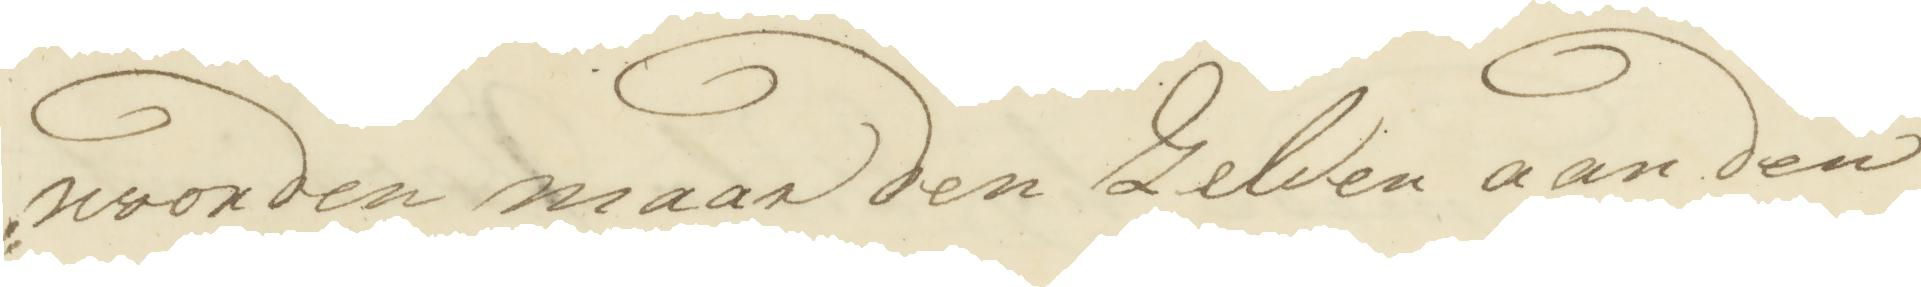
woorden maar den zelven aan den
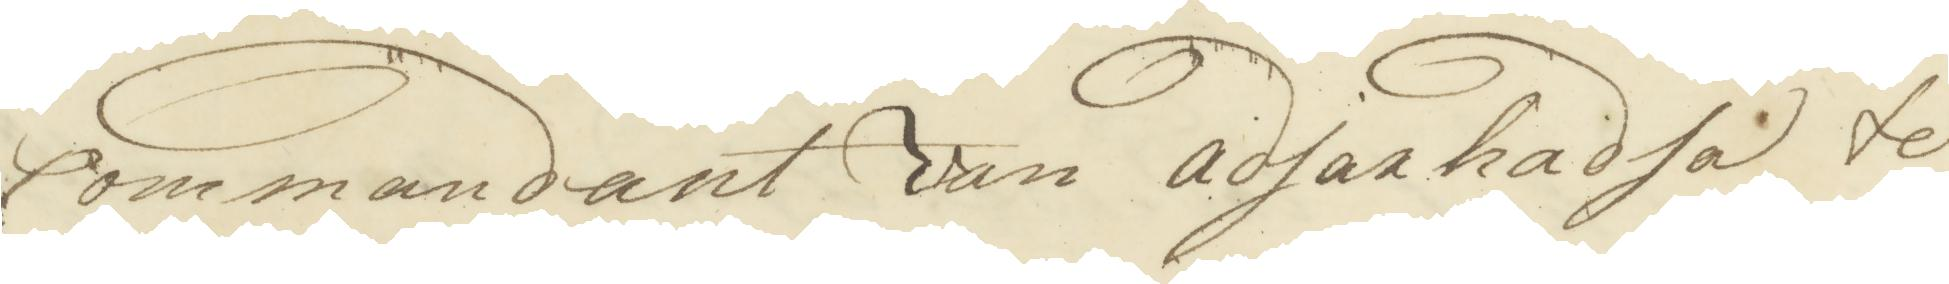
commandant van adjarhadja te
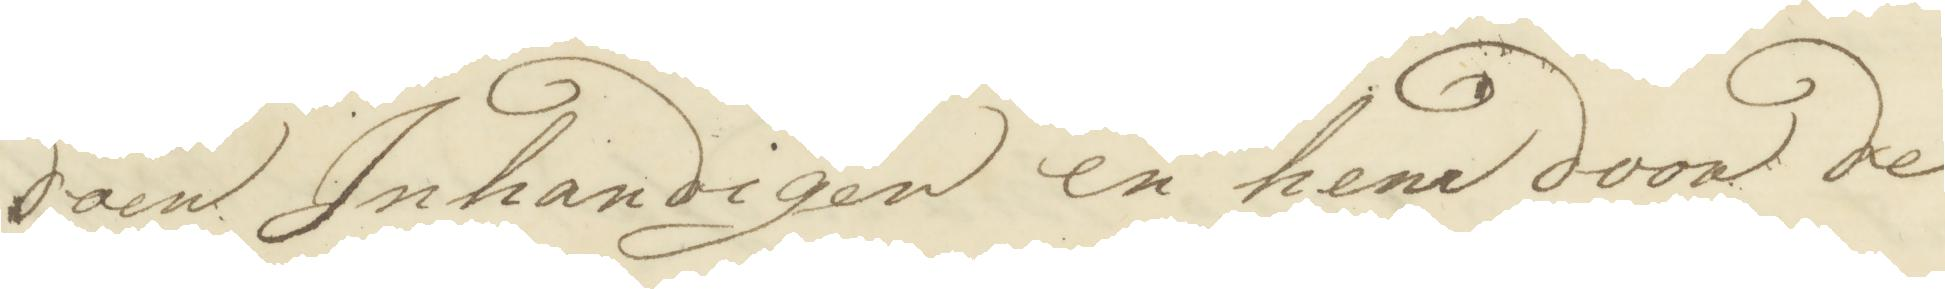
doen Inhandigen en hem door de
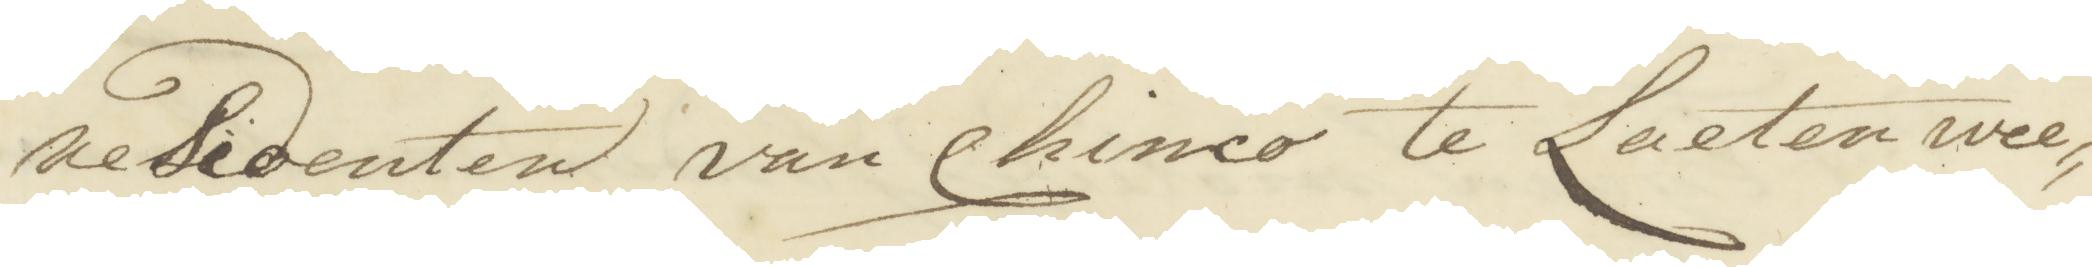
residenten van Chinco te laeten wee„
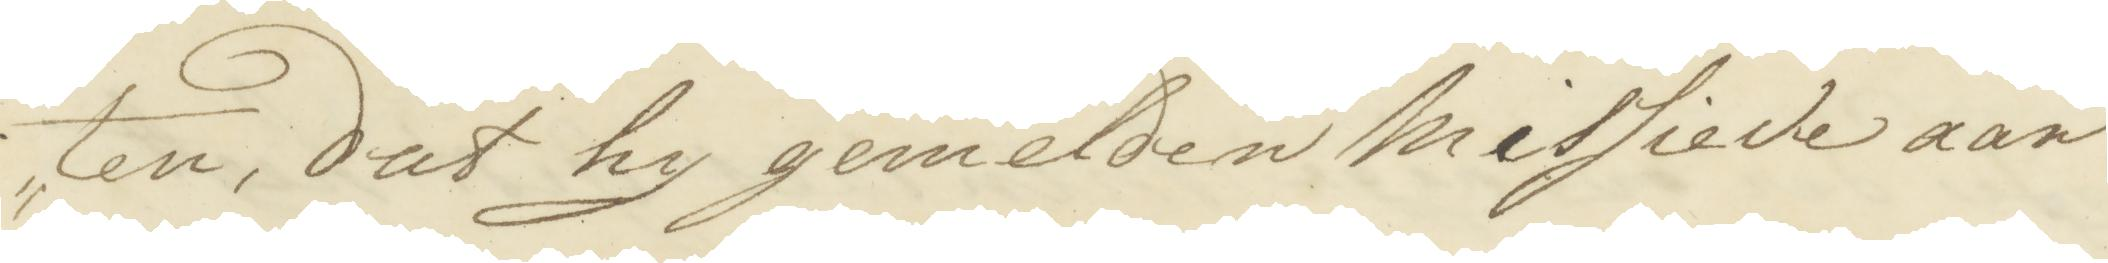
ten, dat hy gemelden missieve aan
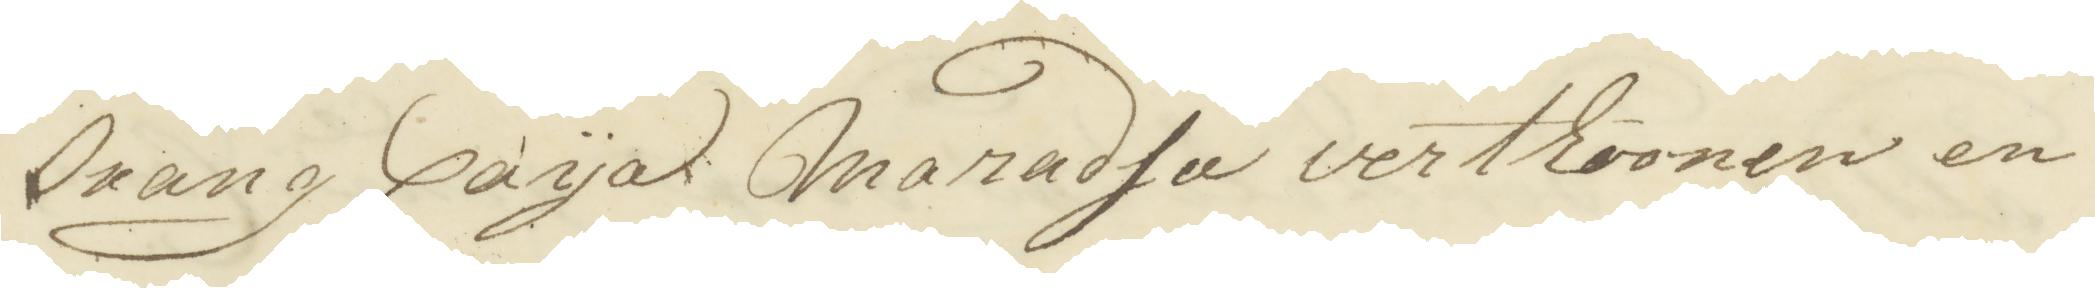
Orang Caija Maradja verthoonen en
